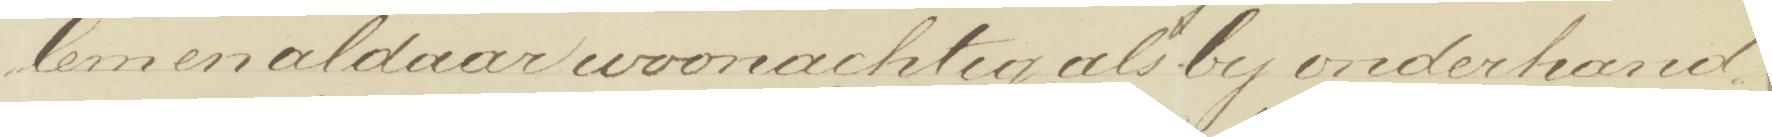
„lem en aldaar woonachtig als by onderhand„
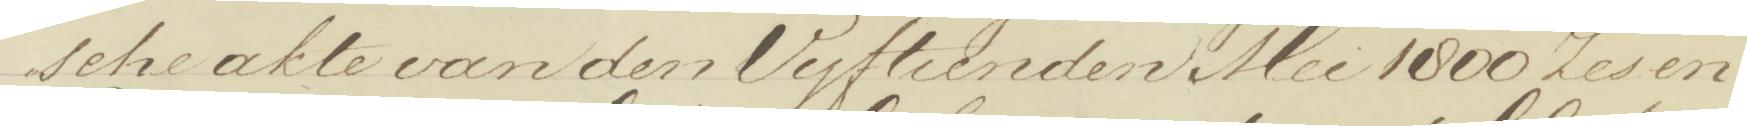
„sche akte van den Vyftienden Mei 1800 Zes en
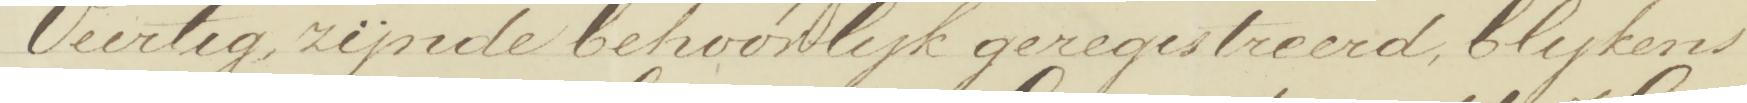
Veertig, zijnde behoorlijk geregistreerd, blykens
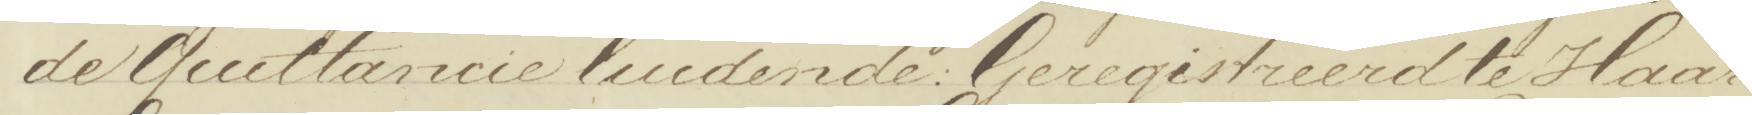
de Quittancie luidende: Geregistreerd te Haar
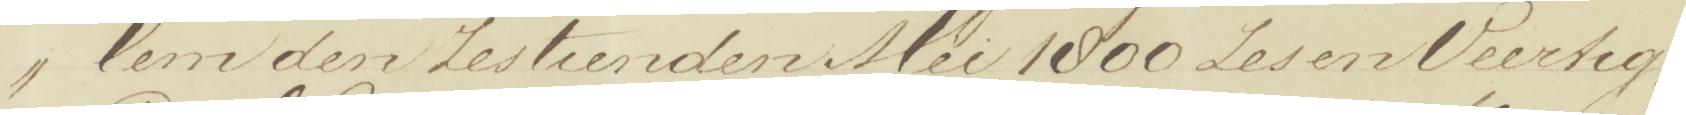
„ lem den Zestienden Mei 1800 Zes en Veertig,
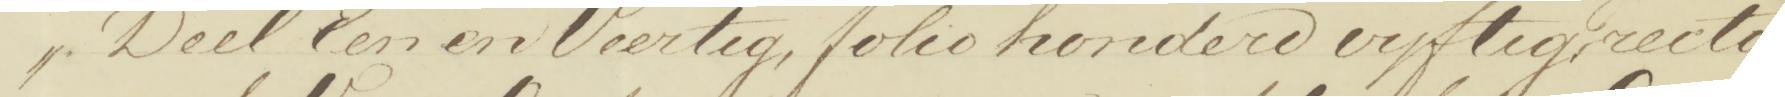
„ Deel Een en Veertig, folio honderd vyftig, recto,
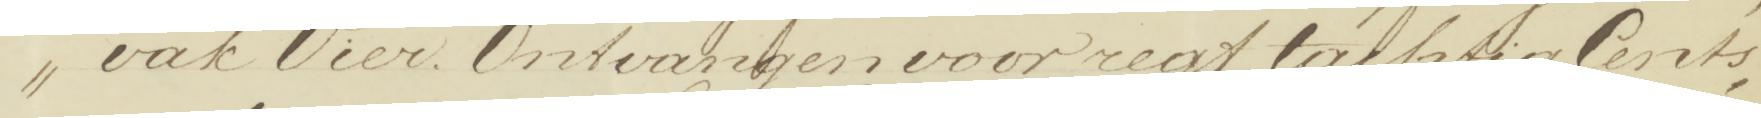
„ vak Vier. Ontvangen voor regt tachtig Cents,
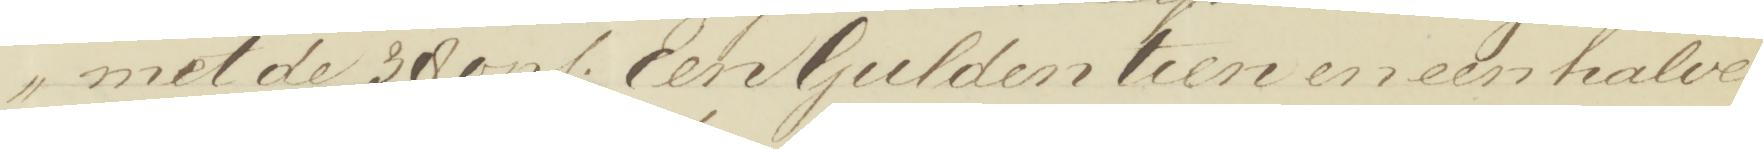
„ met de 38 opC: Een Gulden tien en een halve
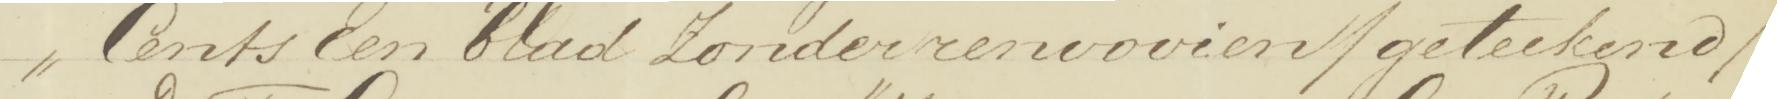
„ Cents Een blad Zonder renvooien / geteekend/
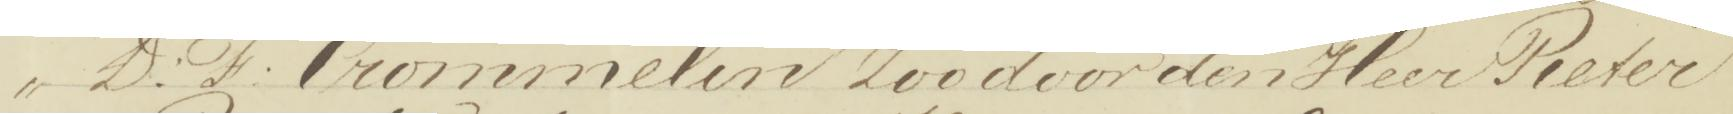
„ D: F: Crommelin" zoo door den Heer Pieter
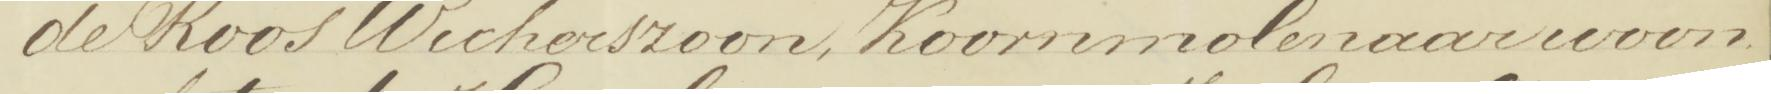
de Roos Wicherszoon, Koornmolenaar woon
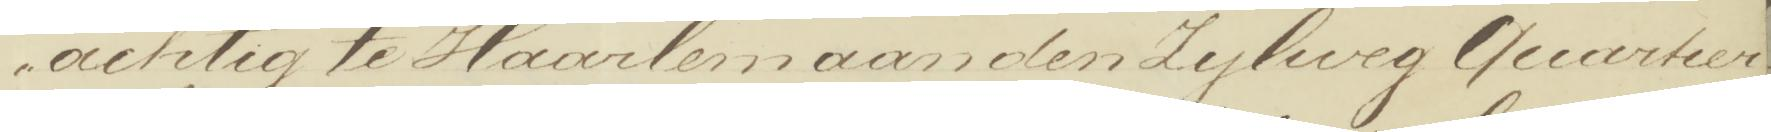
„achtig te Haarlem aan den Zylweg Quartier
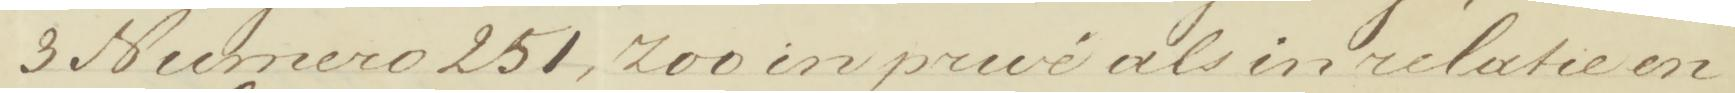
3 Numero 251, zoo in privé als in relatie en
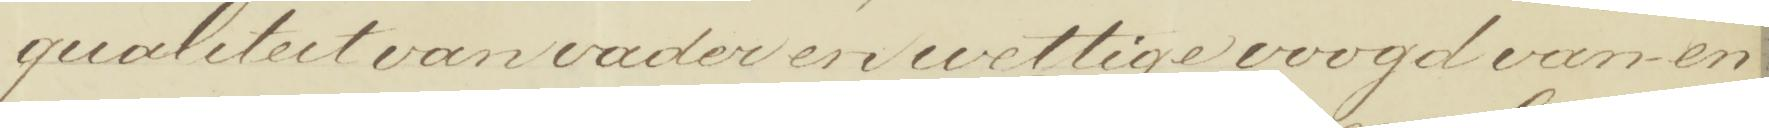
qualiteit van vader en wettige voogd van- en
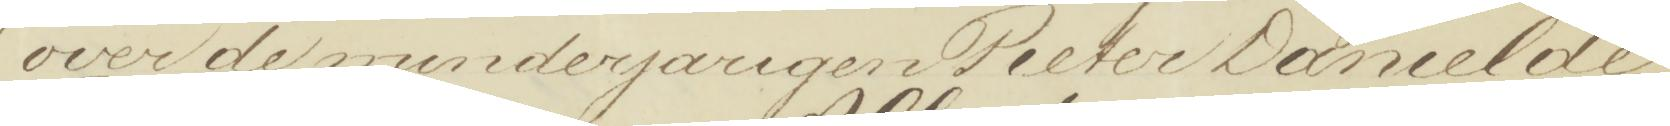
over de minderjarigen Pieter Daniel de
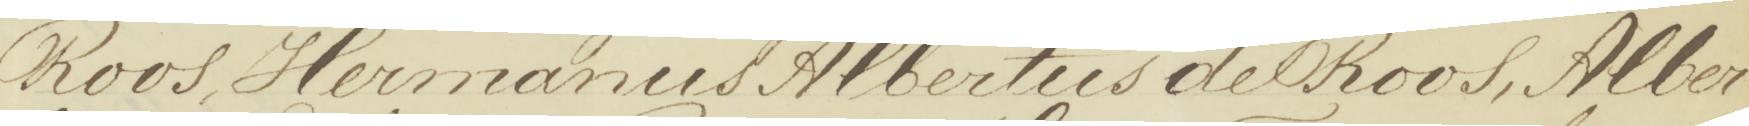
Roos, Hermanus Albertus de Roos, Alber
